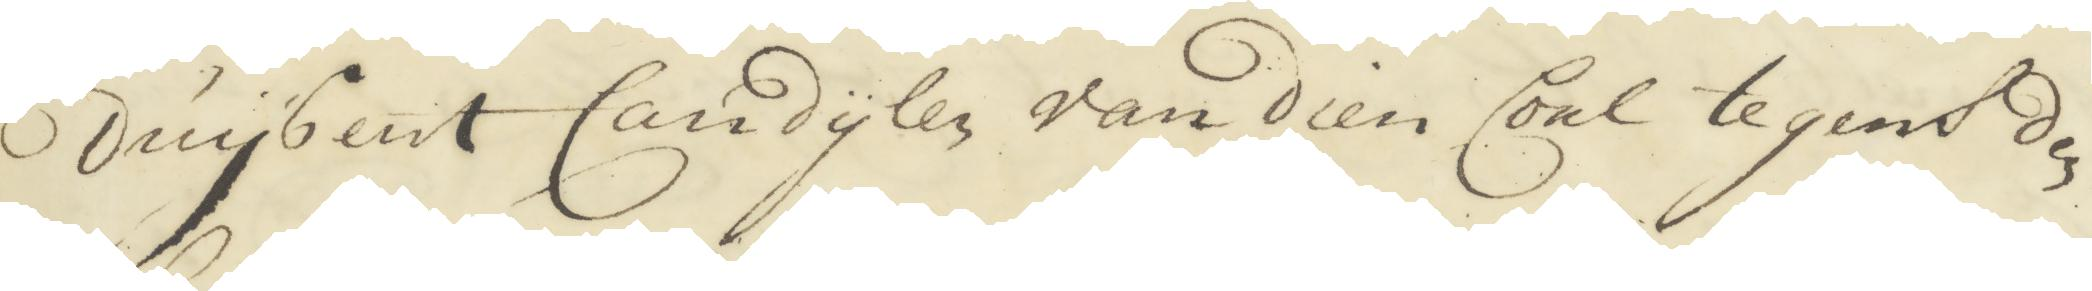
duijsent Candijlen van dien Corl tegens den
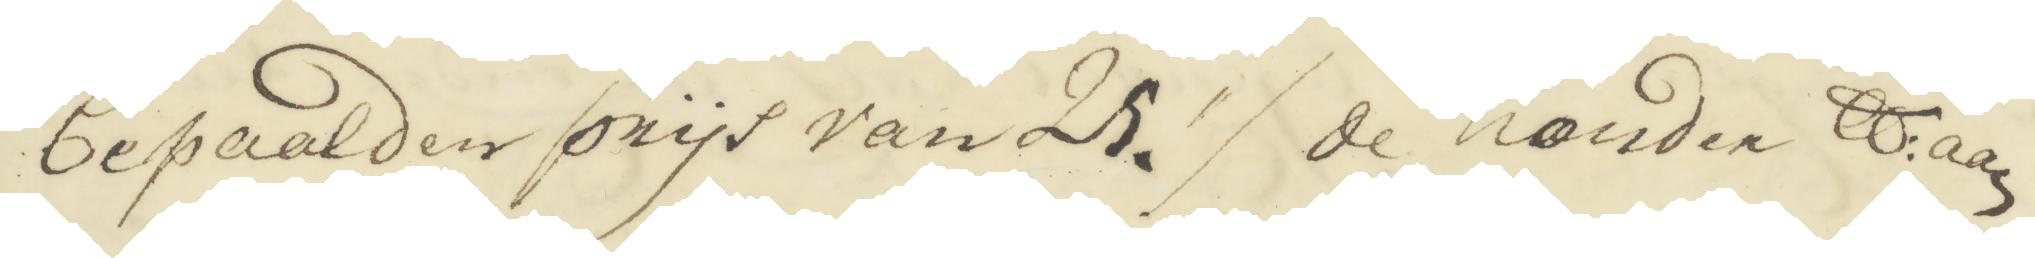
bepaalden prijs van 25." / de houder lb: aan
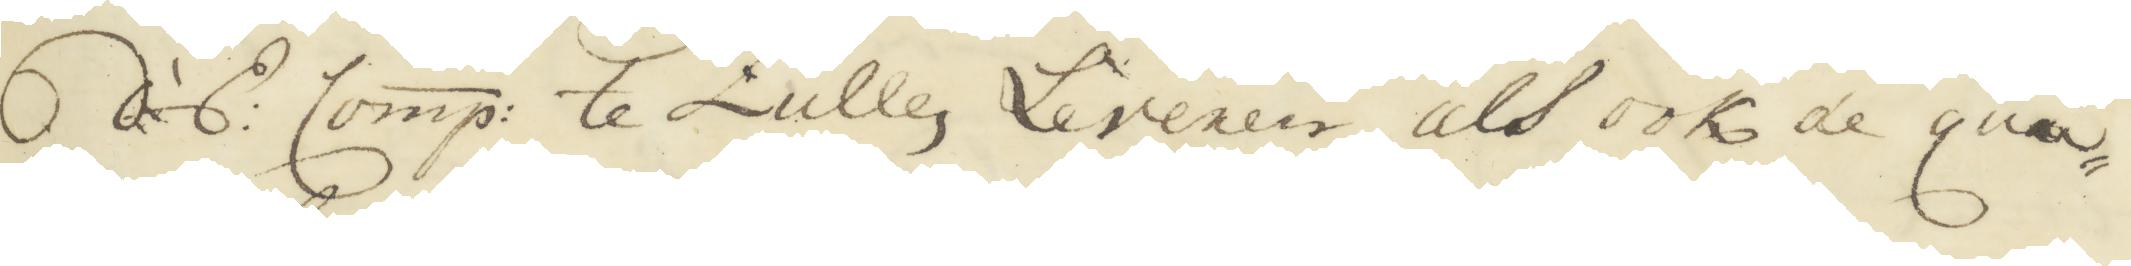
d'E: Comp: te zullen leveren als ook de qua„
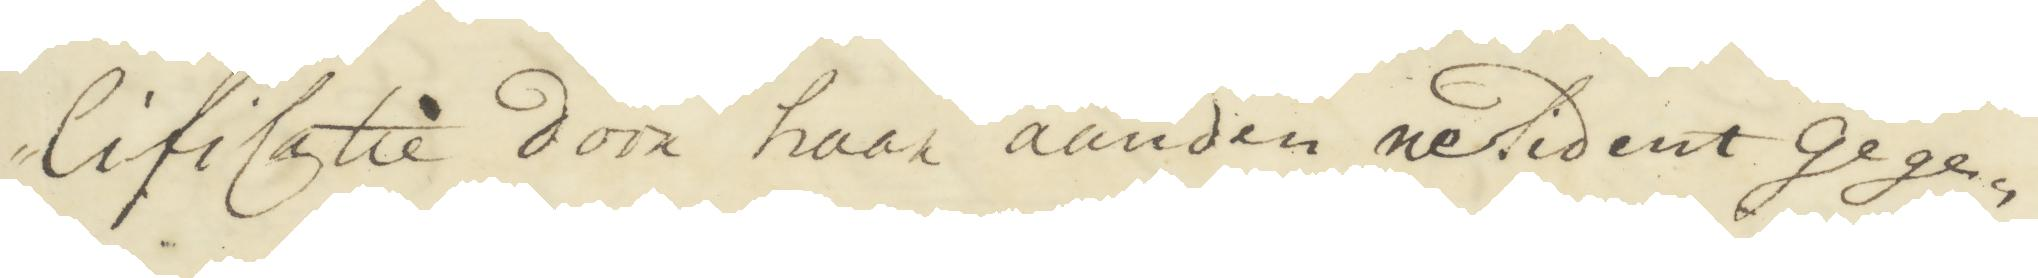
„lificatie door haar aanden resident gege„
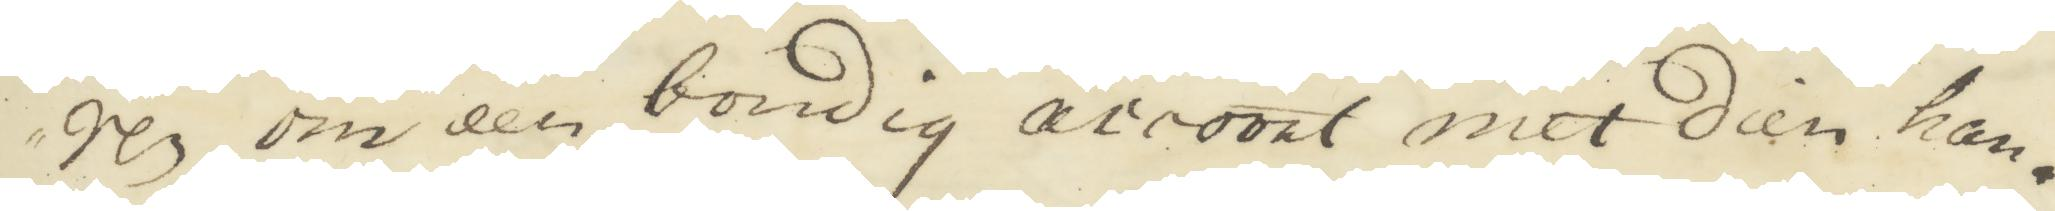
„ven om een bondig accoort met dien han
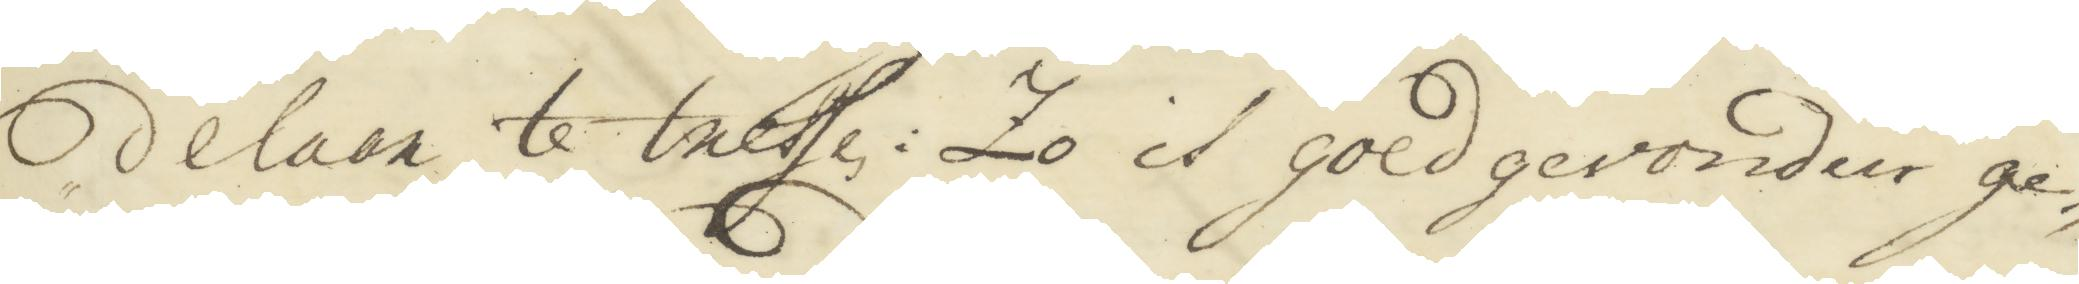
„delaar te treffen: zo is goed gevonden ge„
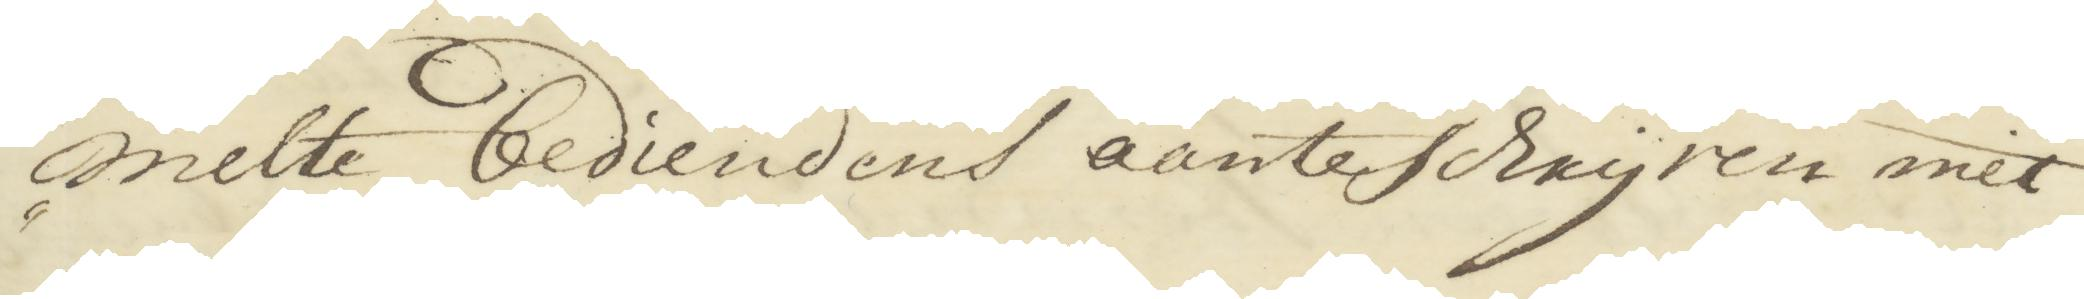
„melte bediendens aanteschrijven met
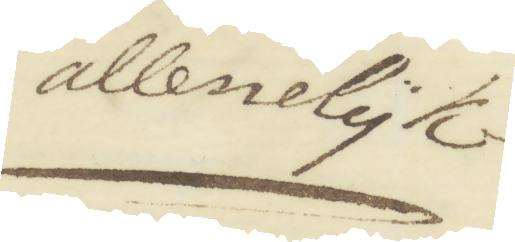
allenelijk
